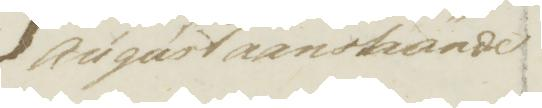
august aanstaande
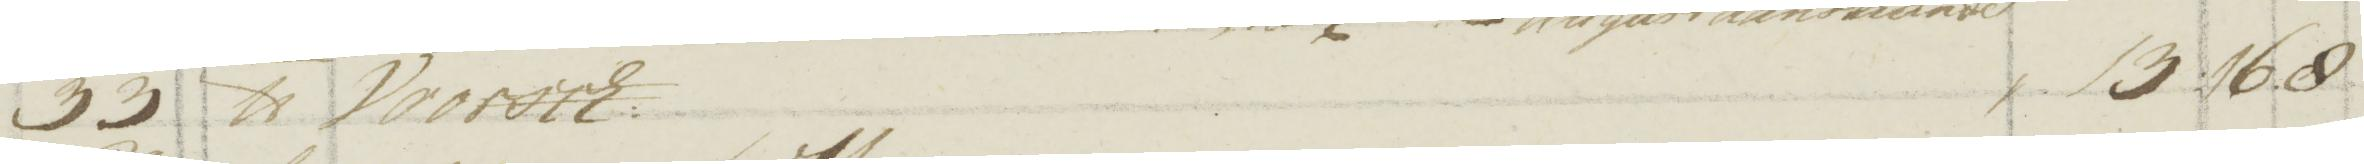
33 lb Voorsch: „ . 13: 16. 8
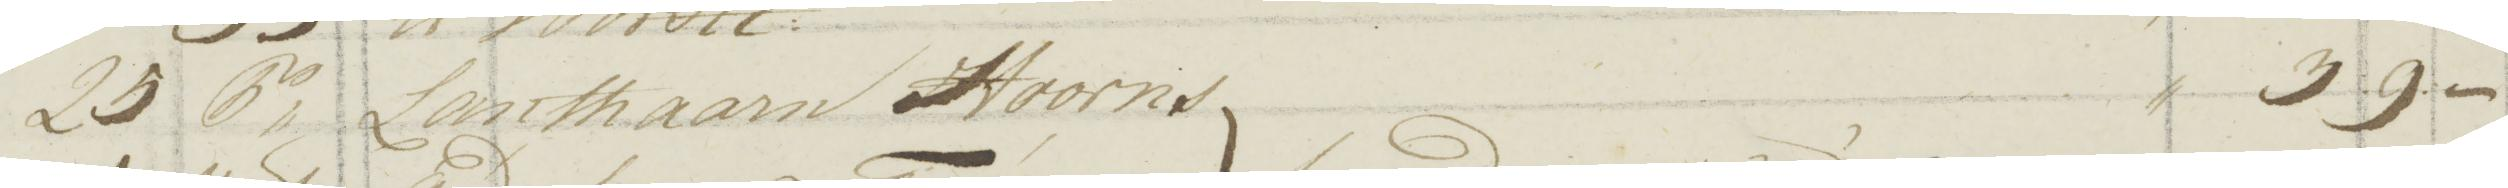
25 P„s Lanthaarn Hoorns „ 3. 9. —
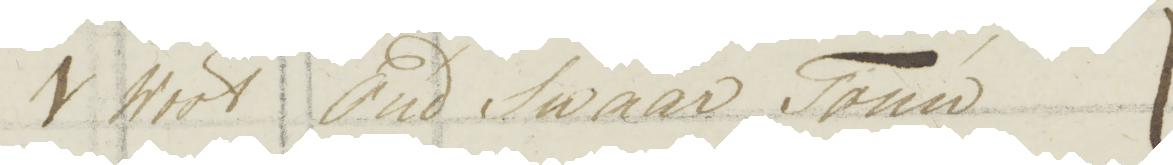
1 Woot Oud swaar Touw
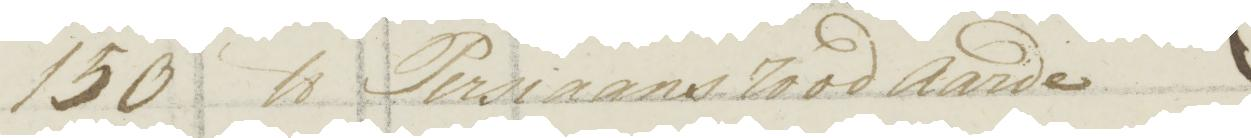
150 lb Persiaans rood aarde
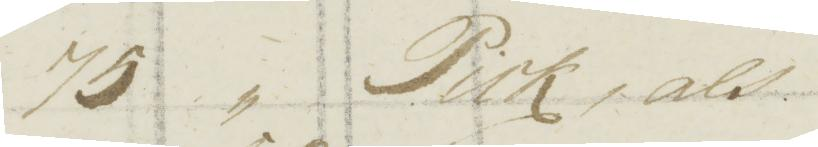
75 „ Pick, als
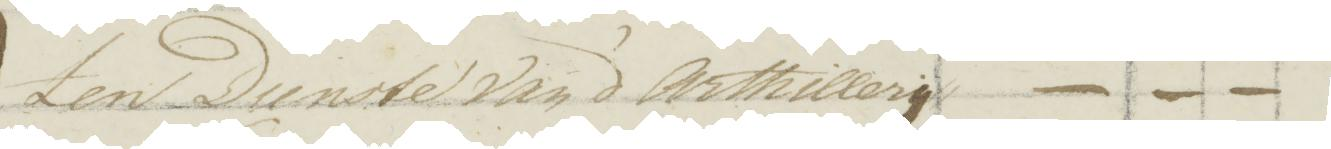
ten Dienste van d'Arthillerij„ — — —
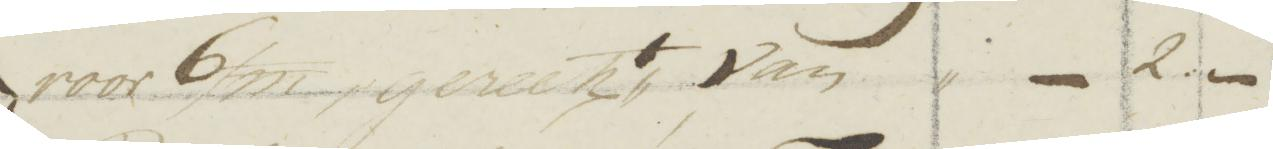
voor 6/m gereek„t van „ — 2: —
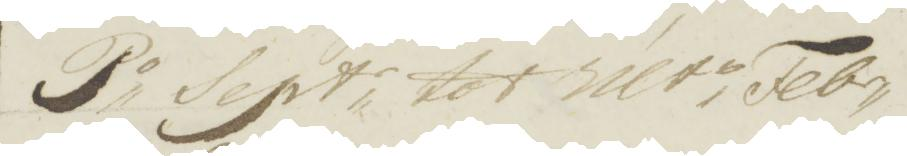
P„o sept„r tot ult„o Feb„r
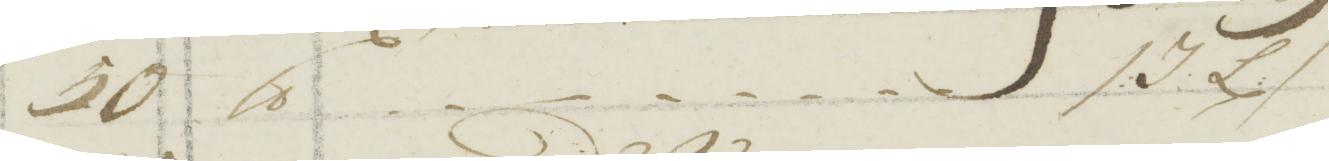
50 lb - - – - - - - - /:J: L:/
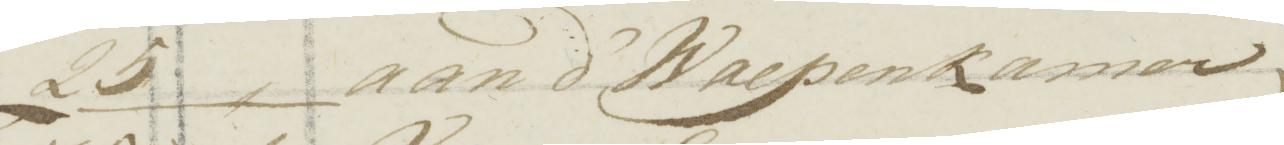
25 „ aan d' Waepenkamer
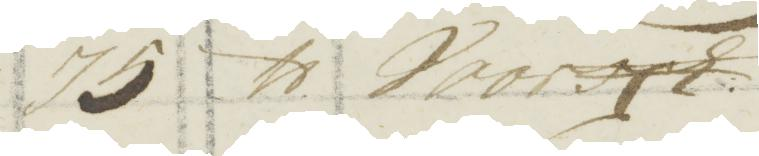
75 lb. Voorsch:
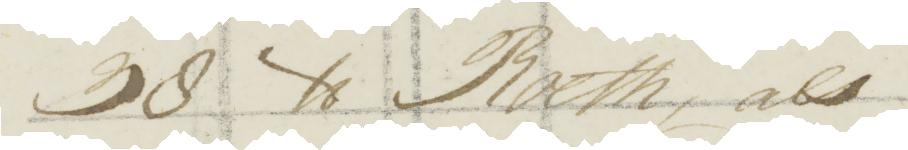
38 lb Roeth, als
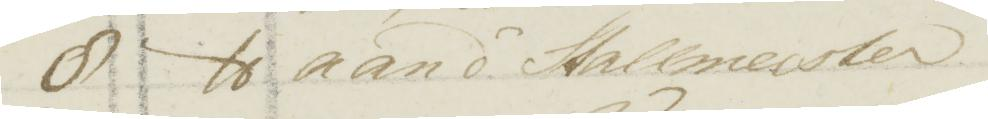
8 lb aan d' stallmeester
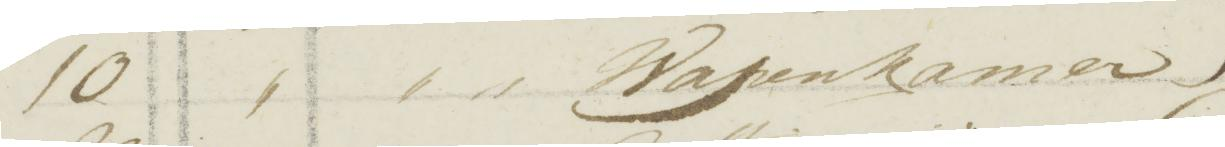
10 „ „ „ Wapenkamer
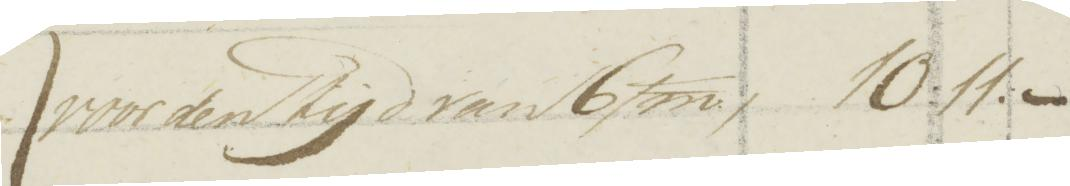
voor den tijd van 6/m, 10: 11:—
